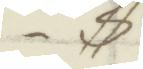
H
